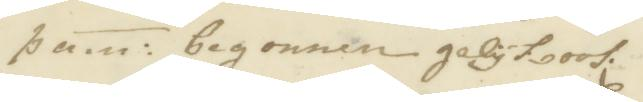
penn: begonnen gelijk ook
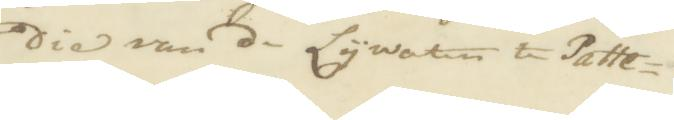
die van de Lijwaten te Patte=
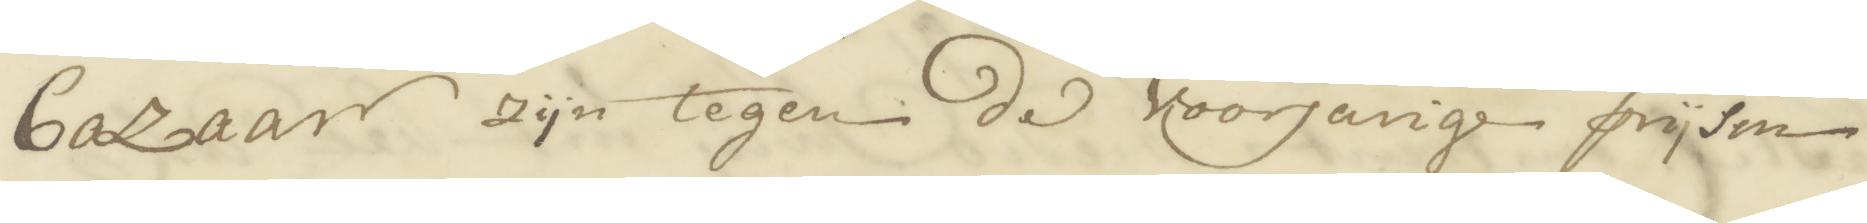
bazaar zijn tegen de voorjarige prijsen
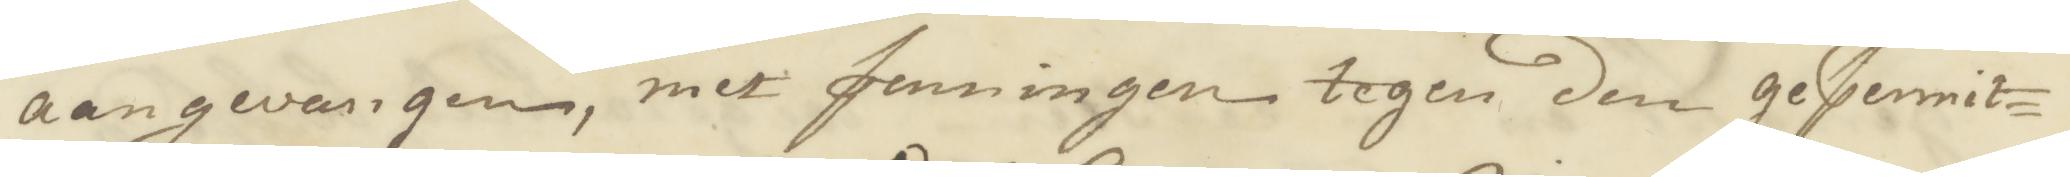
aangevangen, met penningen tegen den gepermit=
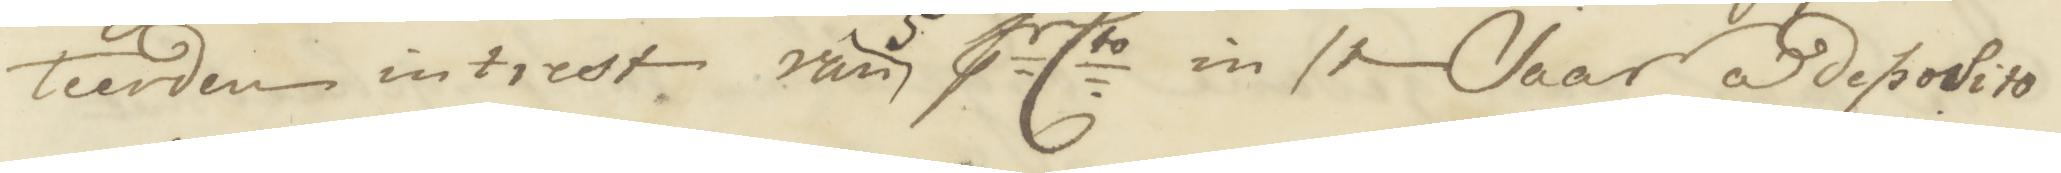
teerden intrest van 5 p=rC=to in /t Jaar a deposito
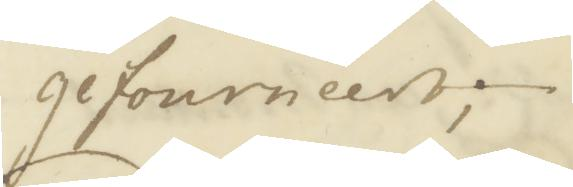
gefourneert;
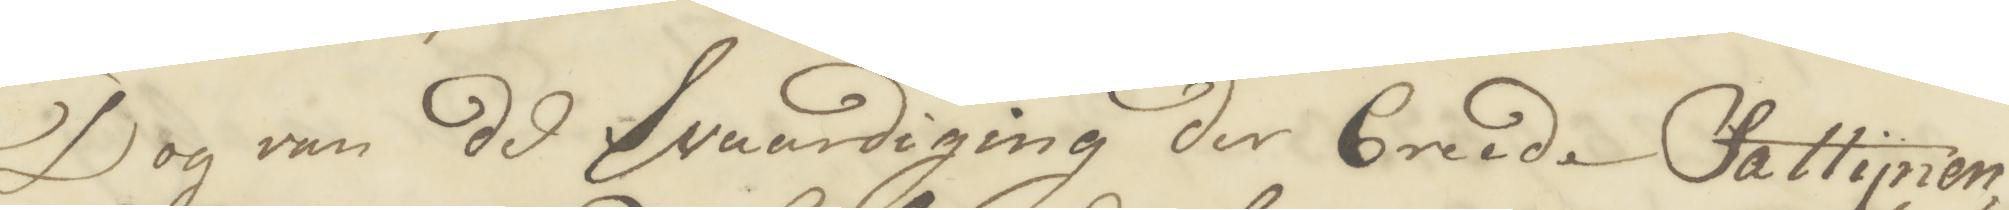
Dog van de vervaardiging der breede Sattijnen,
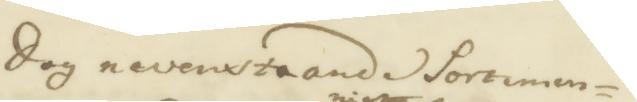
dog nevenstaende sortemen=
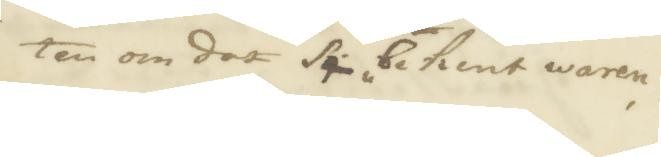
ten om dat sij „ bekent waren,
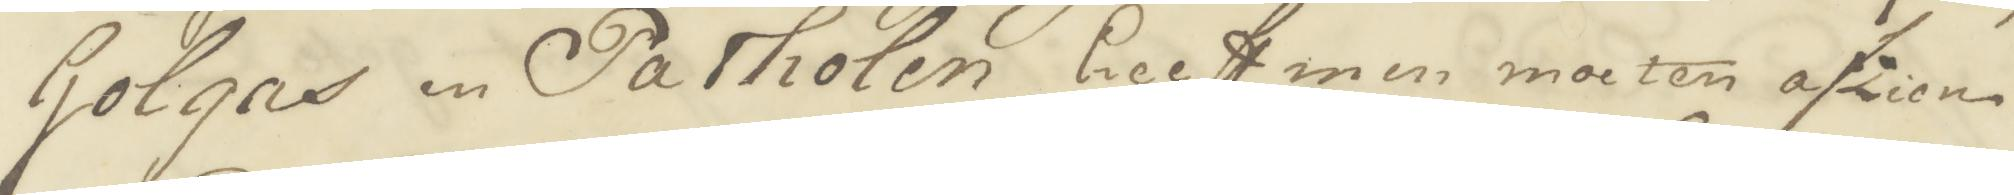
Golgas en Patholen heeft men moeten afzien
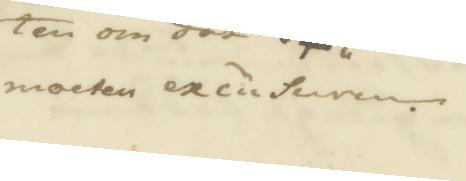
moeten excuseeren.
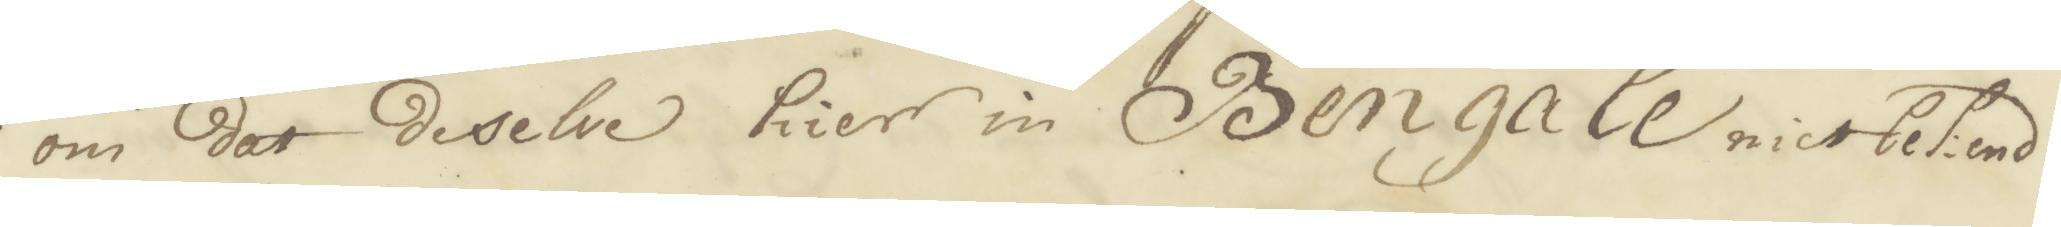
om dat deselve hier in Bengale niet bekend
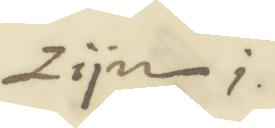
zijn;
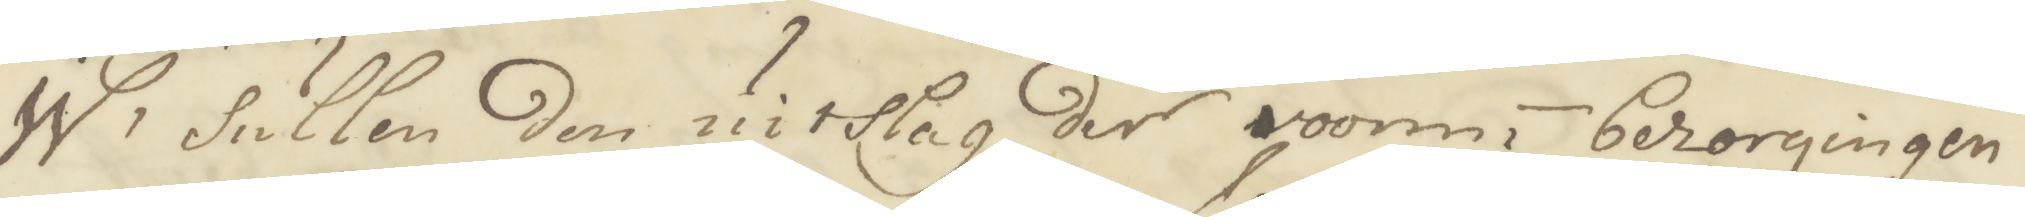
W' sullen den uitslag der voorm: bezorgingen
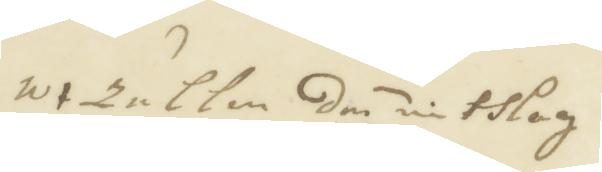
w' zullen den uitslag
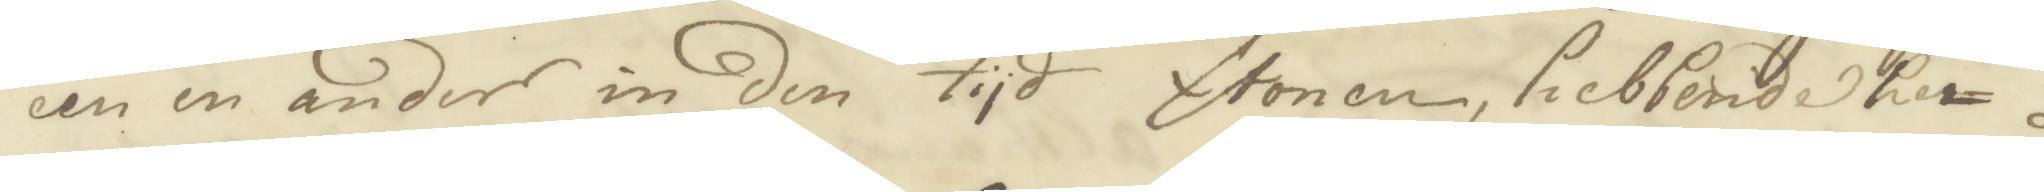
een en ander in den tijd vertonen, hebbende het
